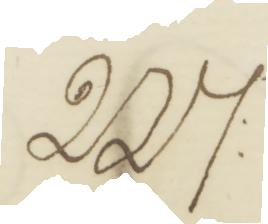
227:
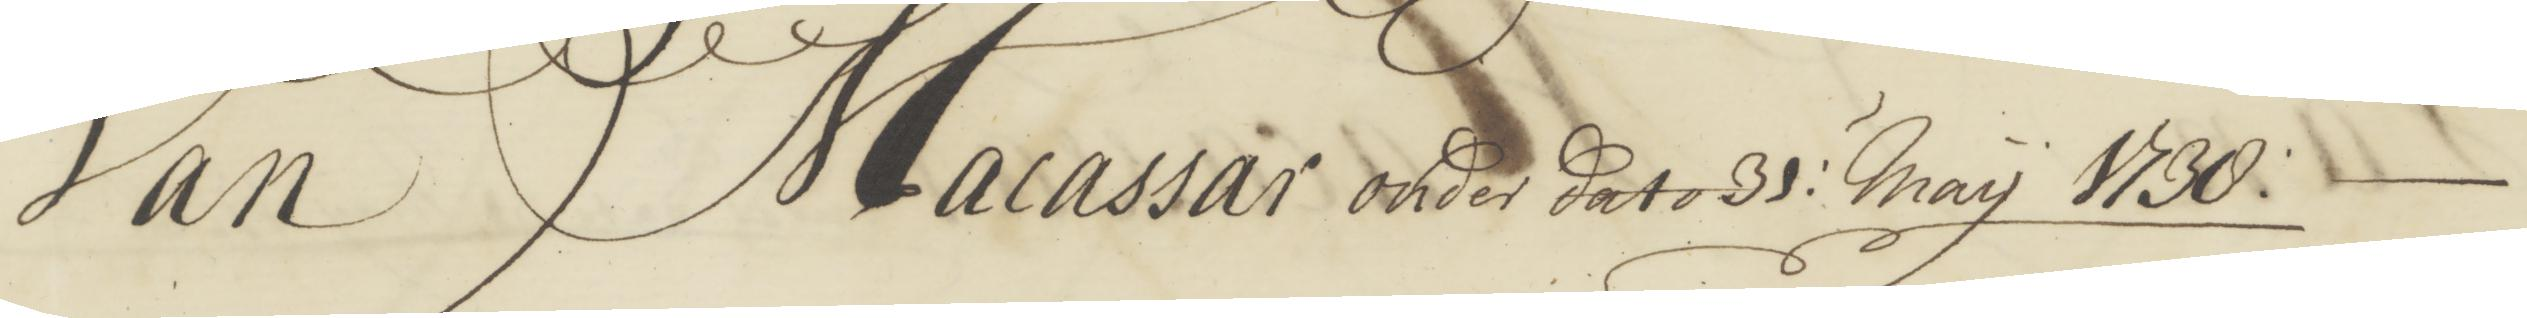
Van Macassar onder dato 31:' maij 1738: —
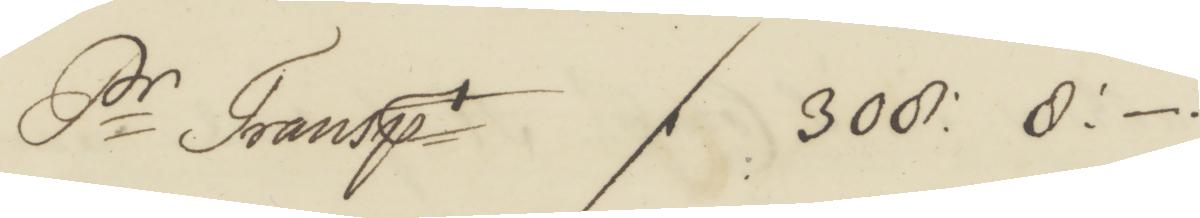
P=r Transp=t ƒ 308: 8: —.
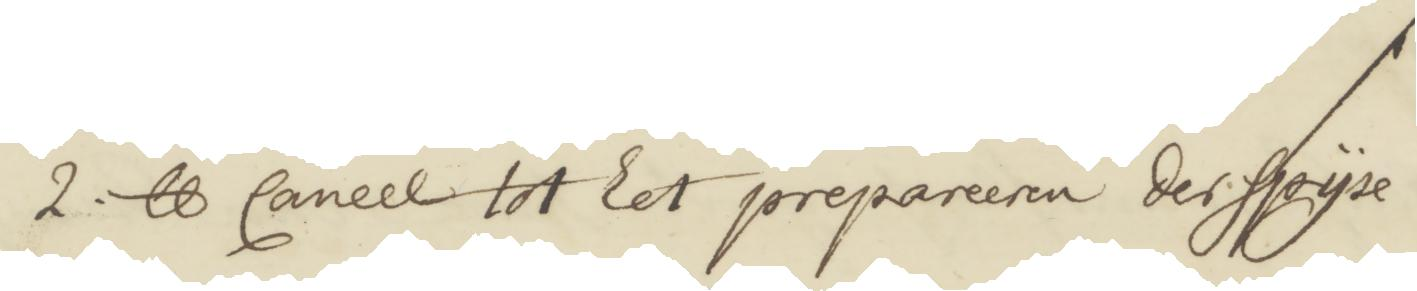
2. lb Caneel tot het prepareeren der spijse
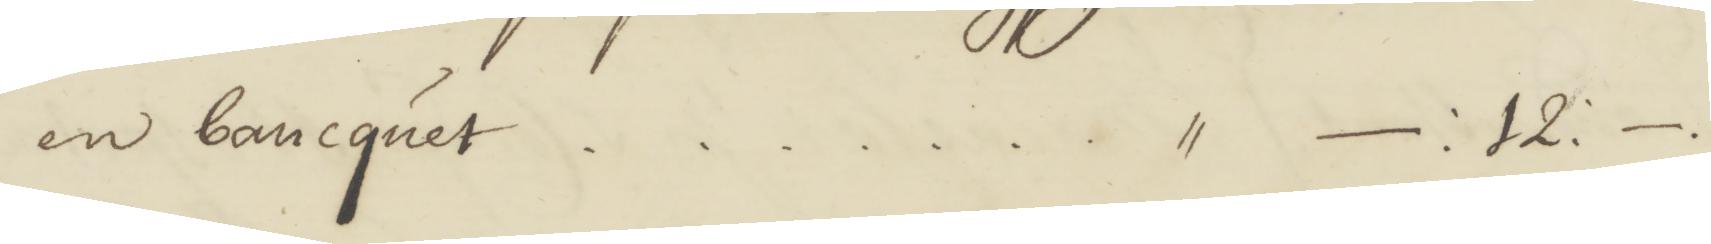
en bancquet . . . . . . . „ —: 12: —.
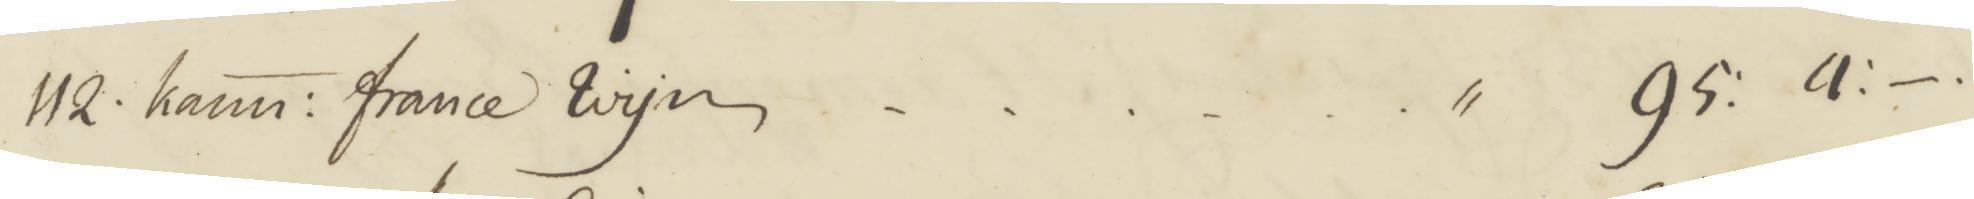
112. kann: france wijn . . . . . . „ 95: 4: —.
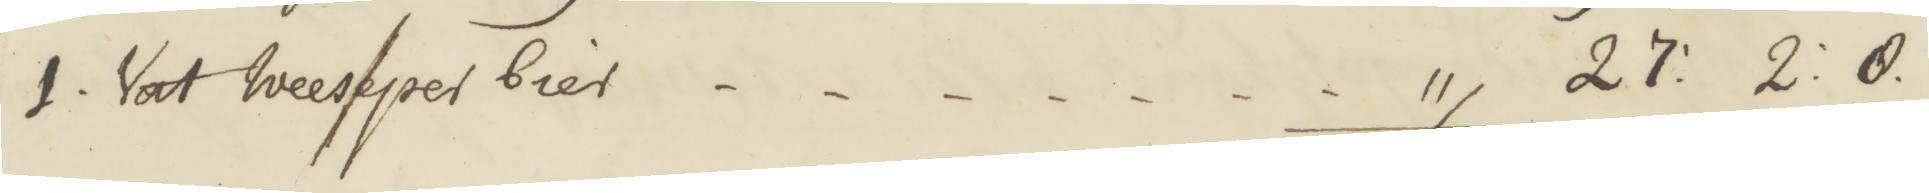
1. Vat weespper bier . . . . . . . „ 27: 2: 8.
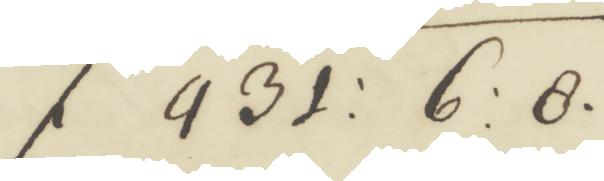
ƒ 431: 6: 8.
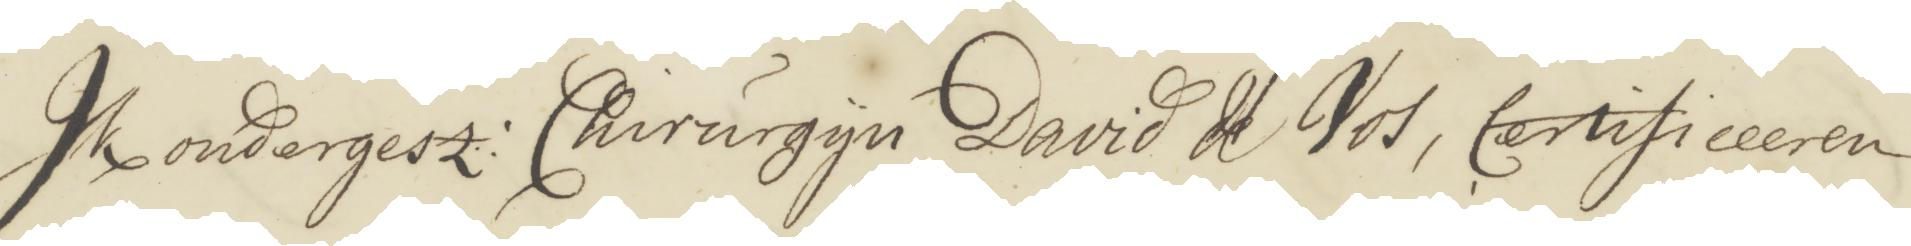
Jk ondergesz: Chirurgijn David de Vos, Certificeeren
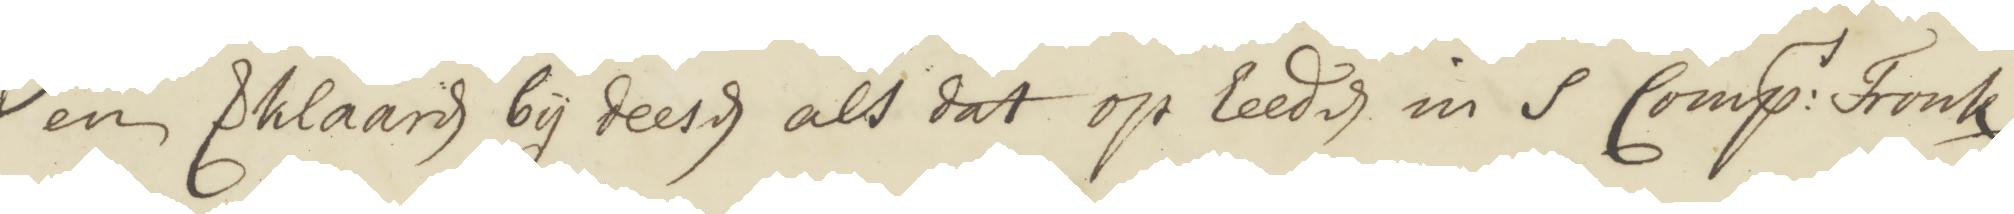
en verklaaren bij deesen als dat op heeden in ’s Comp:s Tronk
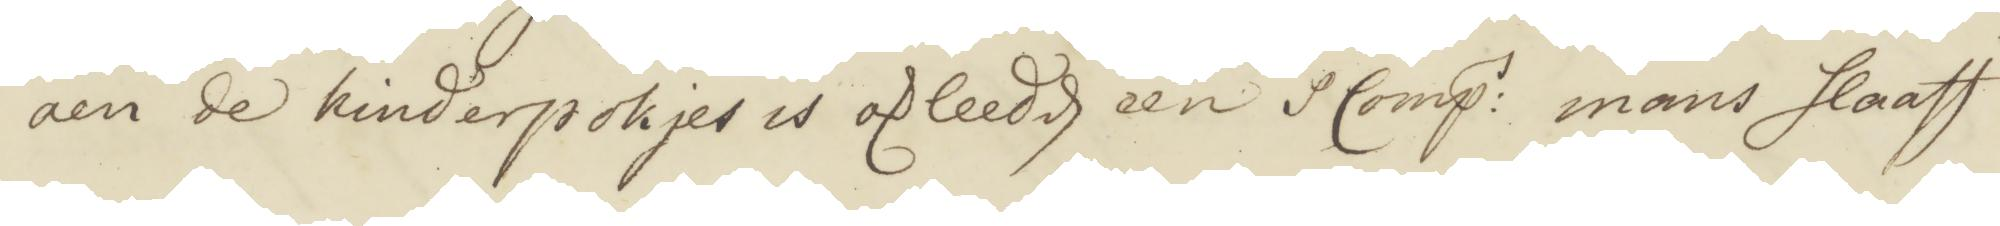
aen de kinderpokjes is overleeden een ’s Comp:s mans slaaff
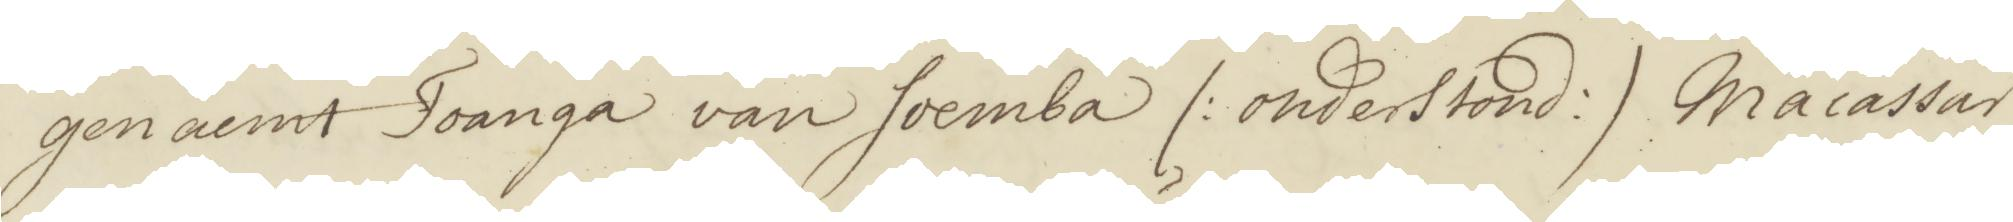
genaemt Toanga van soemba (:onderstond:) Macassar
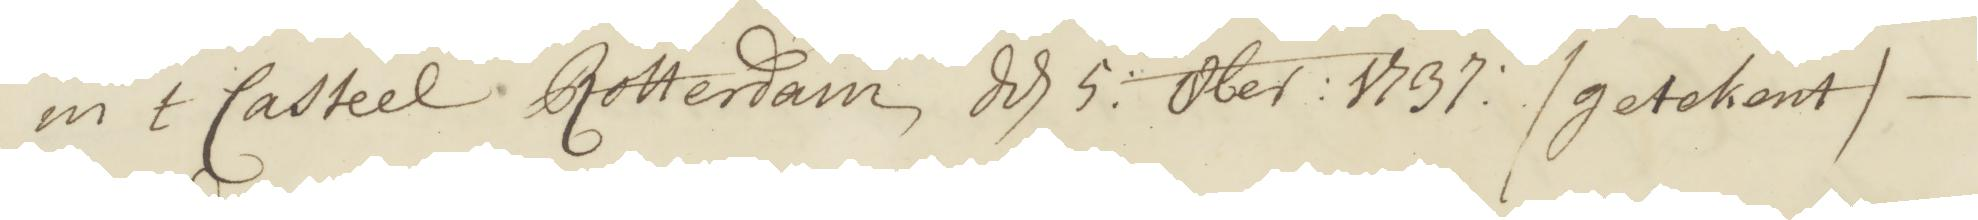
in ’t Casteel Rotterdam den 5:' 8ber: 1737: /getekent/ —
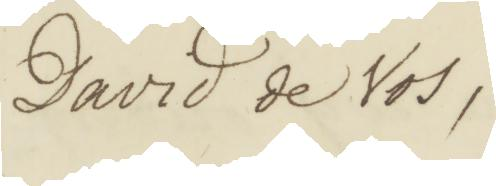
David de Vos,
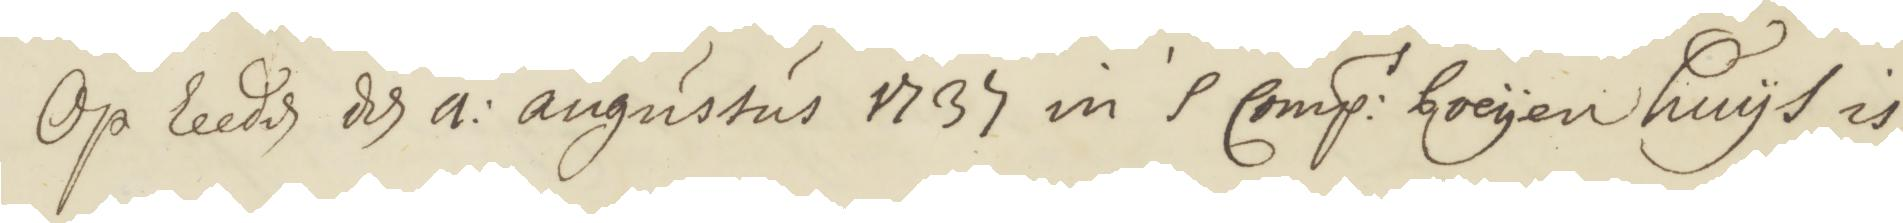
Op heeden den 4: augustus 1737 in ’s Comp:s boeijen huijs is
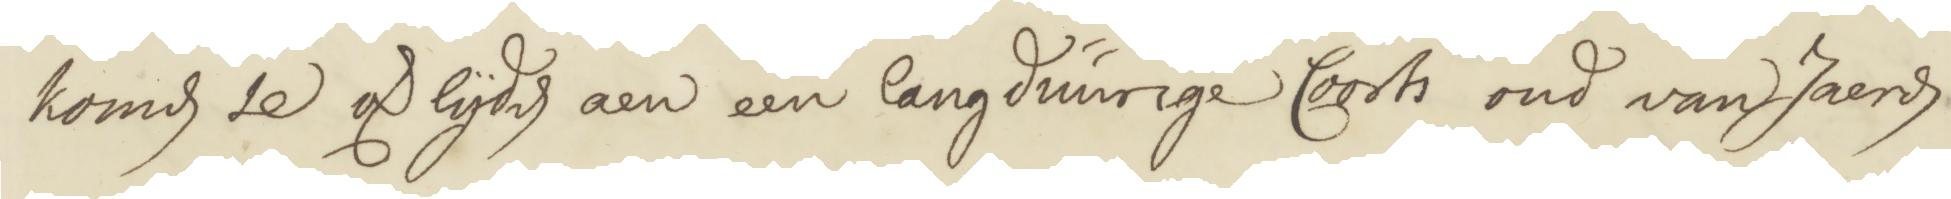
komen te overlijden aen een langduurige Coorts oud van Jaeren
